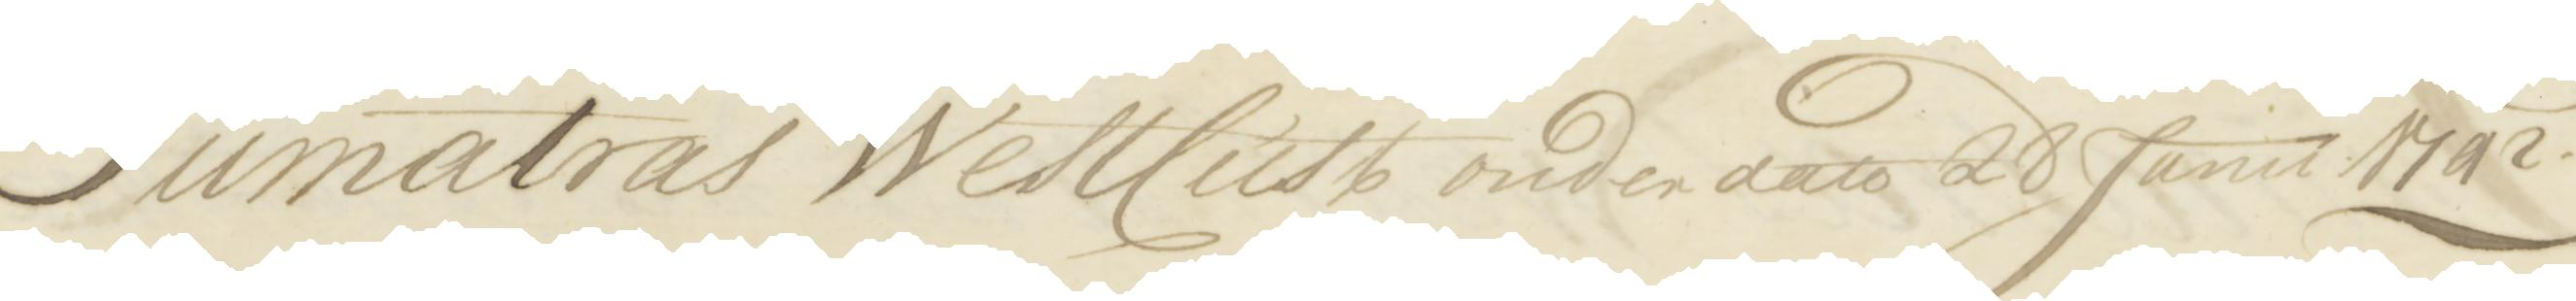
Sumatras Westcust onder dato 28 Janu: 1742.
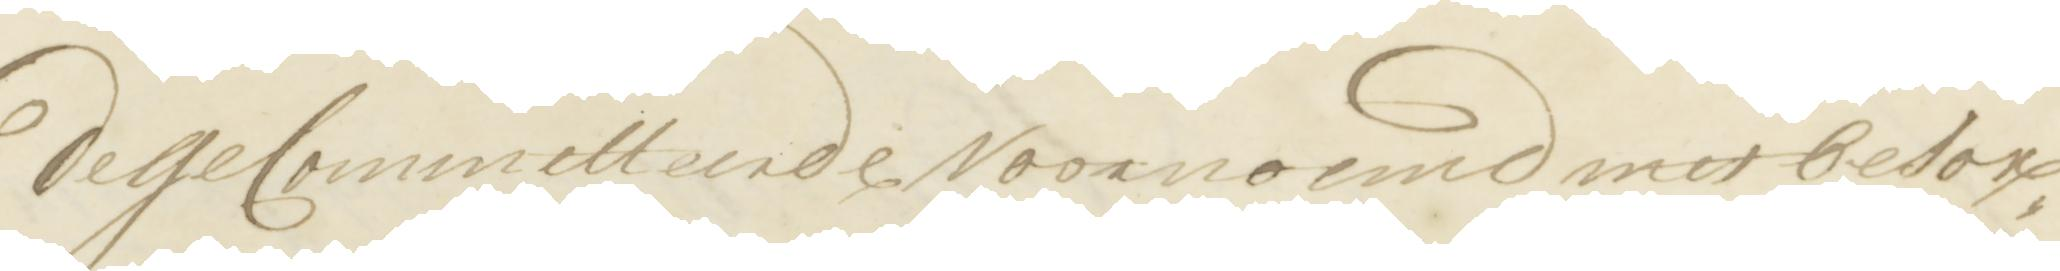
de gecommitteerde voornoemd met besor„
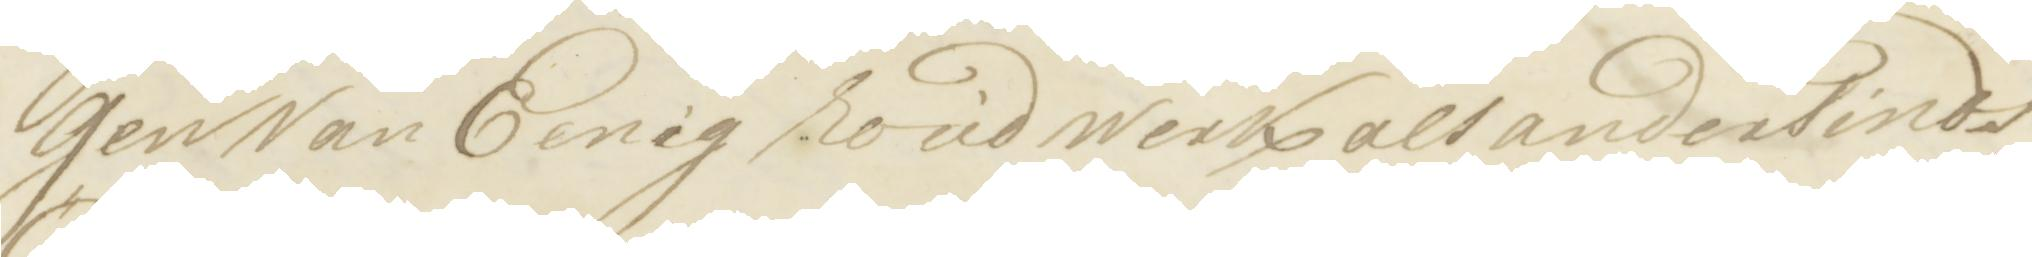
gen van Eenig houd werk als andersinds
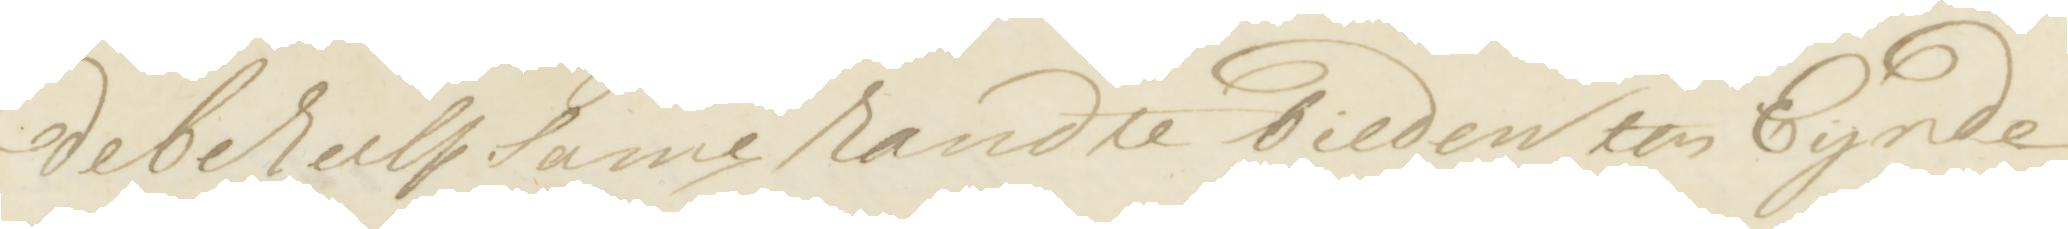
de behulpsame hand te bieden ten Eijnde
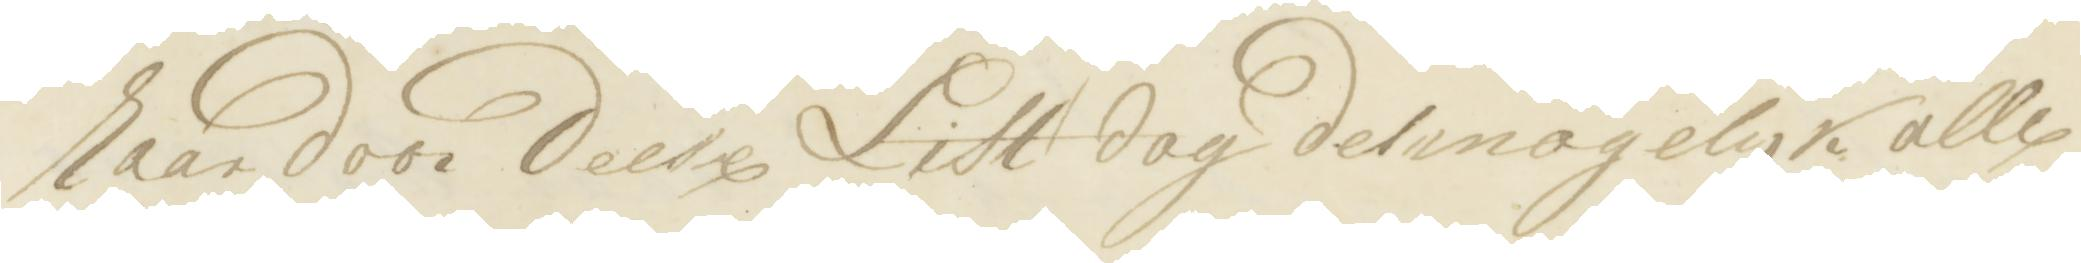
haar door deese List dog des mogelyk alle
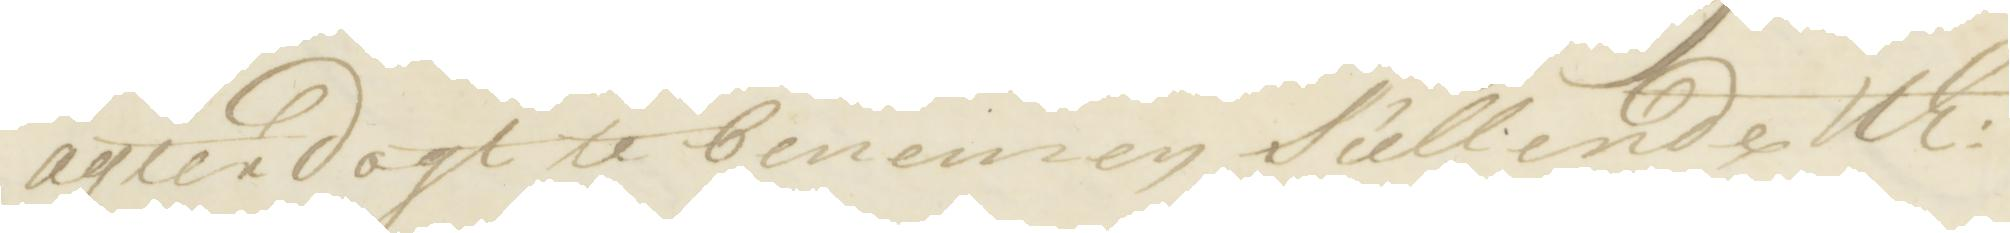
agterdogt te benemen, sullende UE:
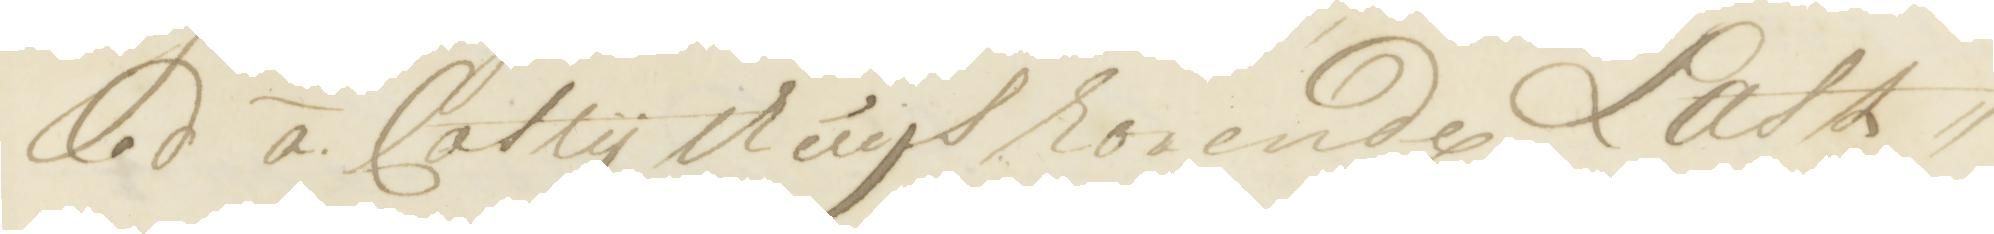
d a. Castijthuys horende Last„
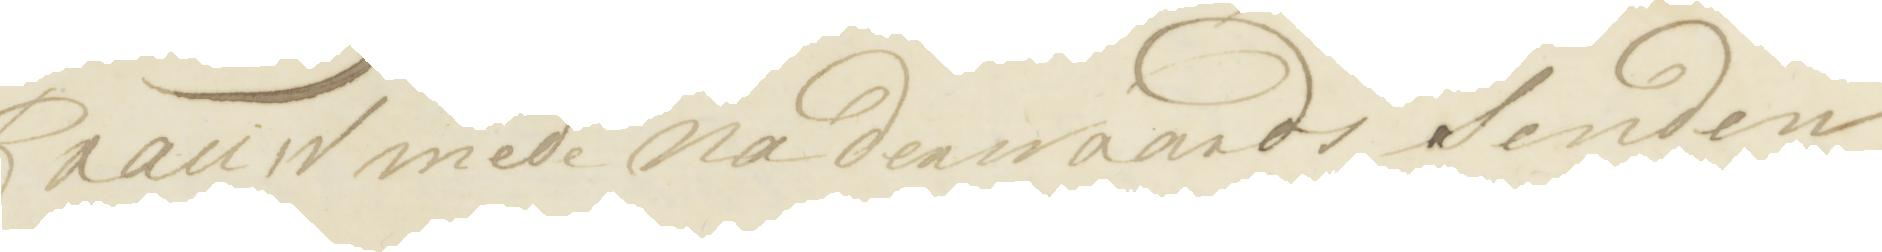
rauw mede na den waards senden
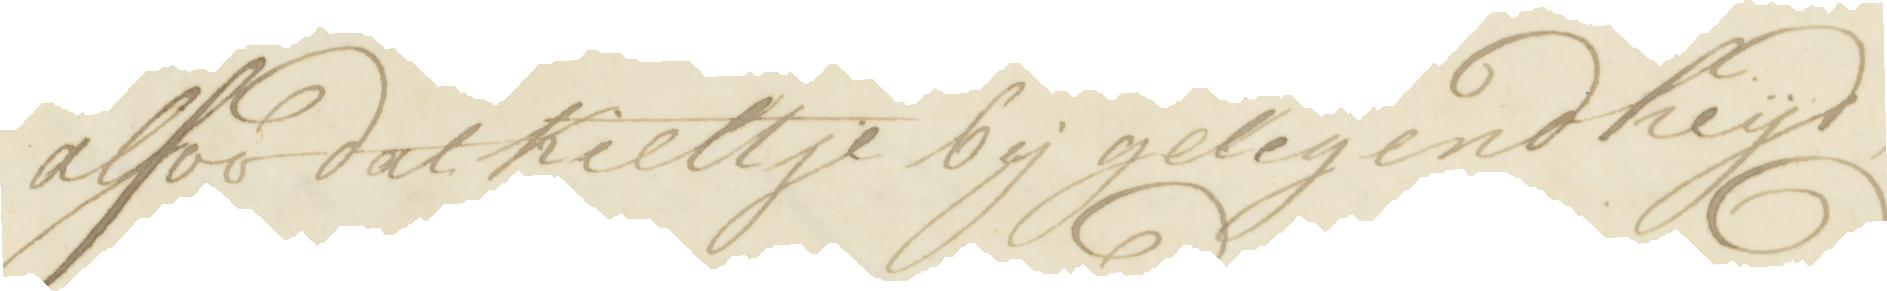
alsoo dat kieltje bij gelegendheijd
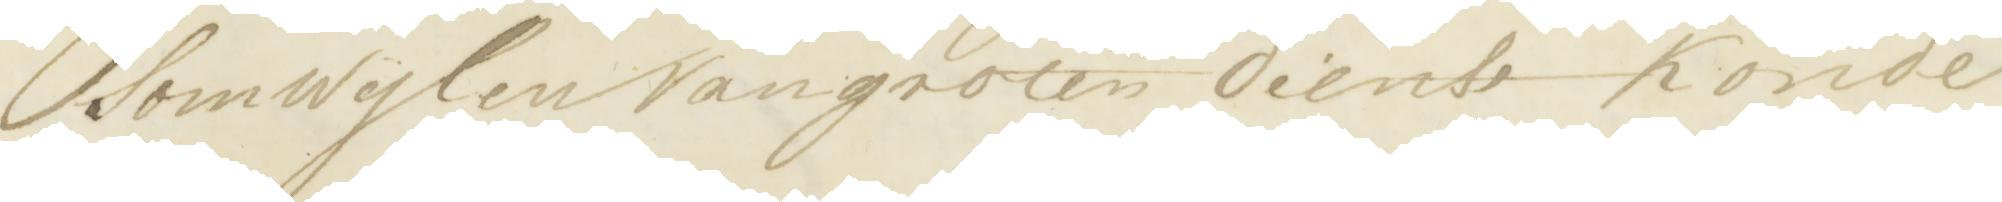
somwijlen van groten dienst konde
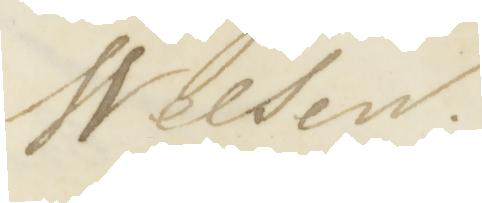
weesen.
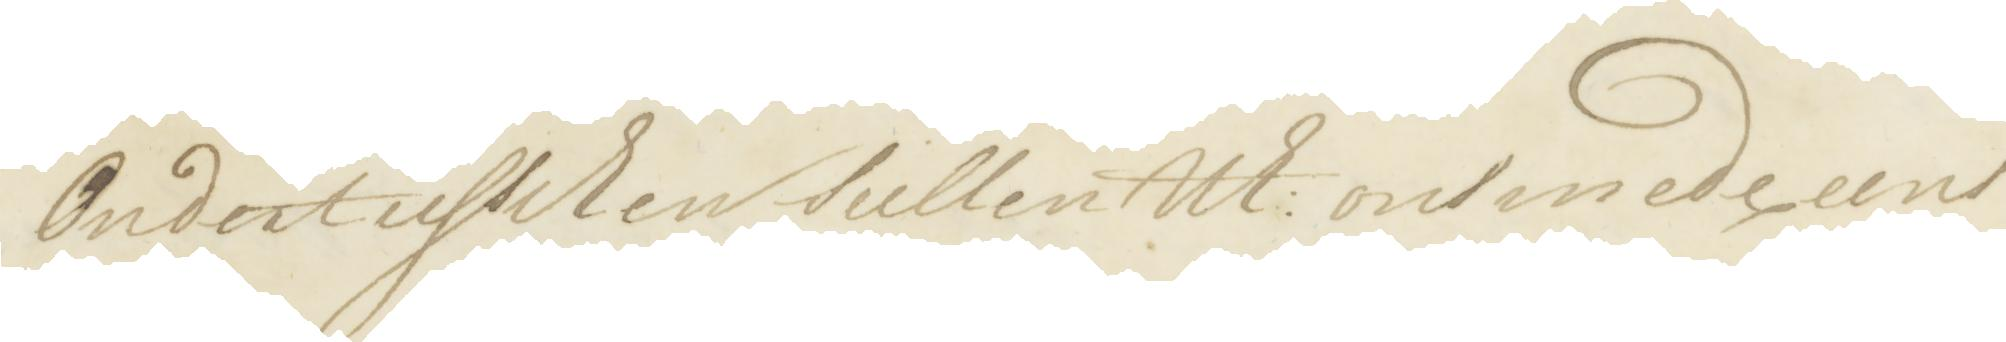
Ondertusschen sullen uE: ons mede eens
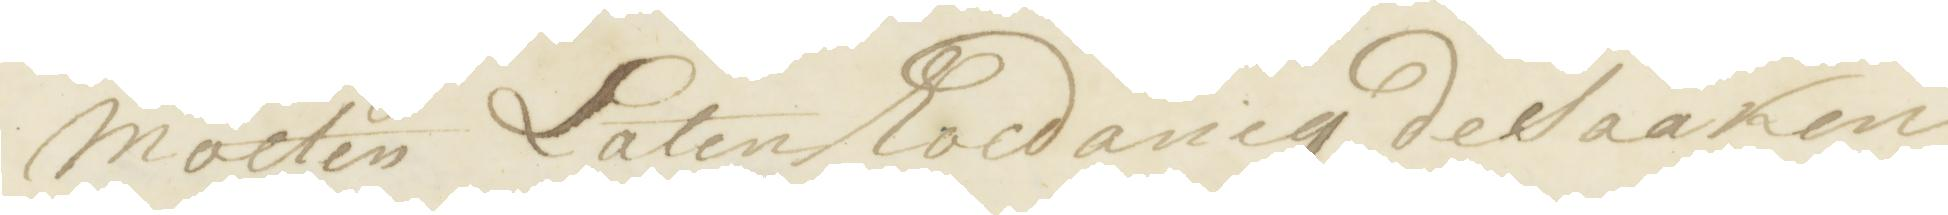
moeten Laten hoedanig de saaken
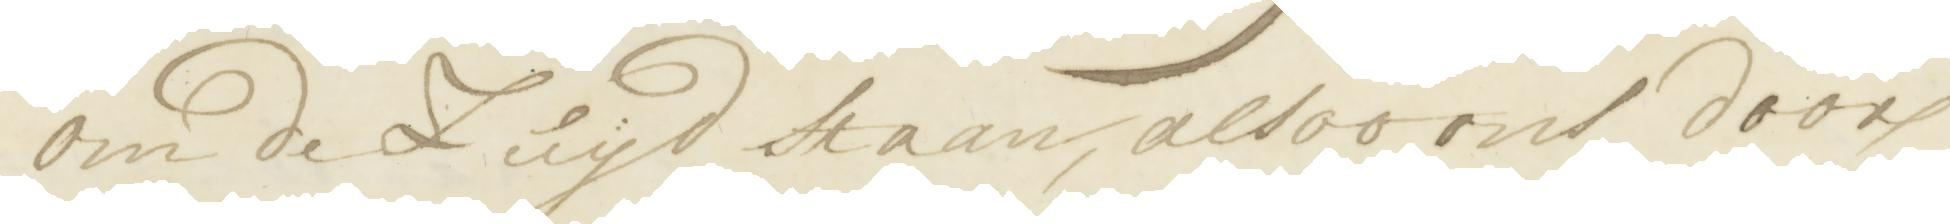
om de zuijd staan, alsoo ons door
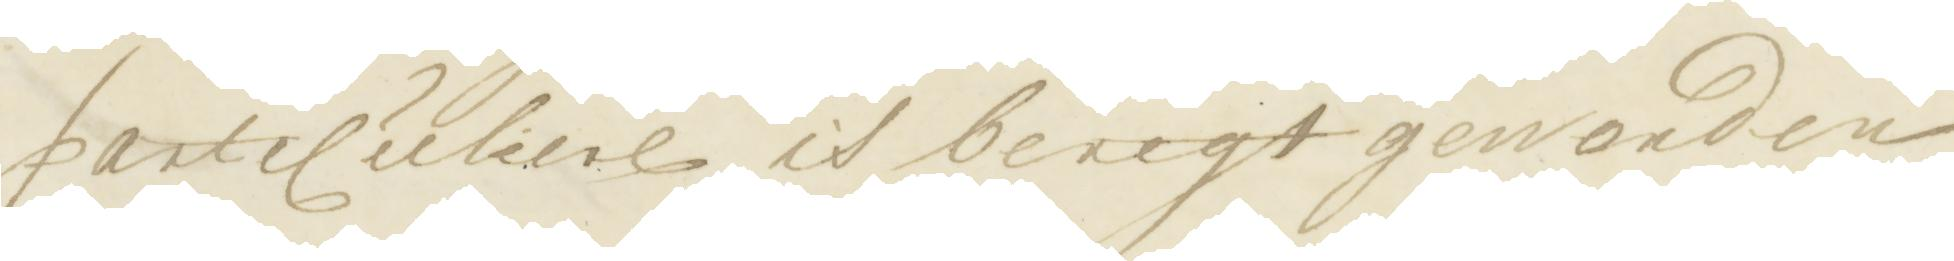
particuliere is berigt geworden
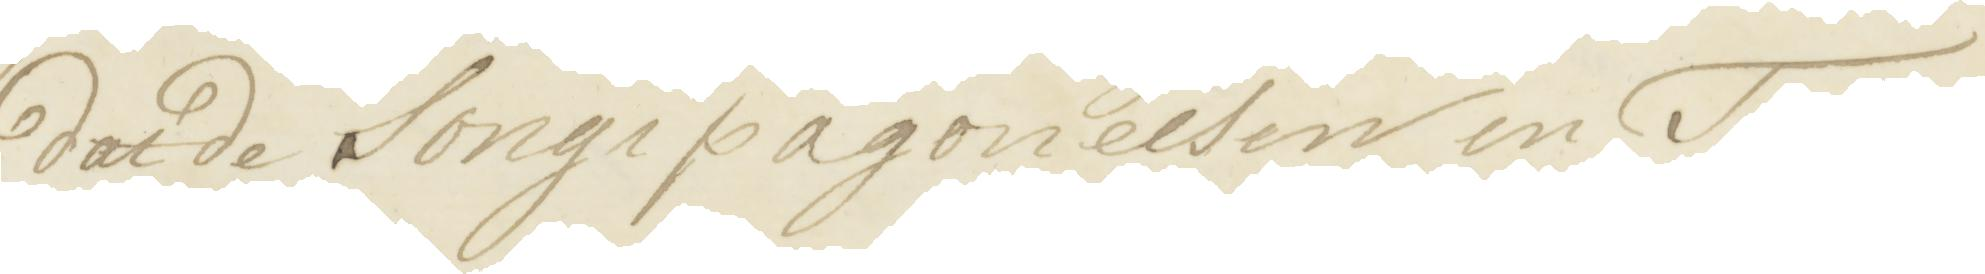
dat de songipagoneesen en Tam
